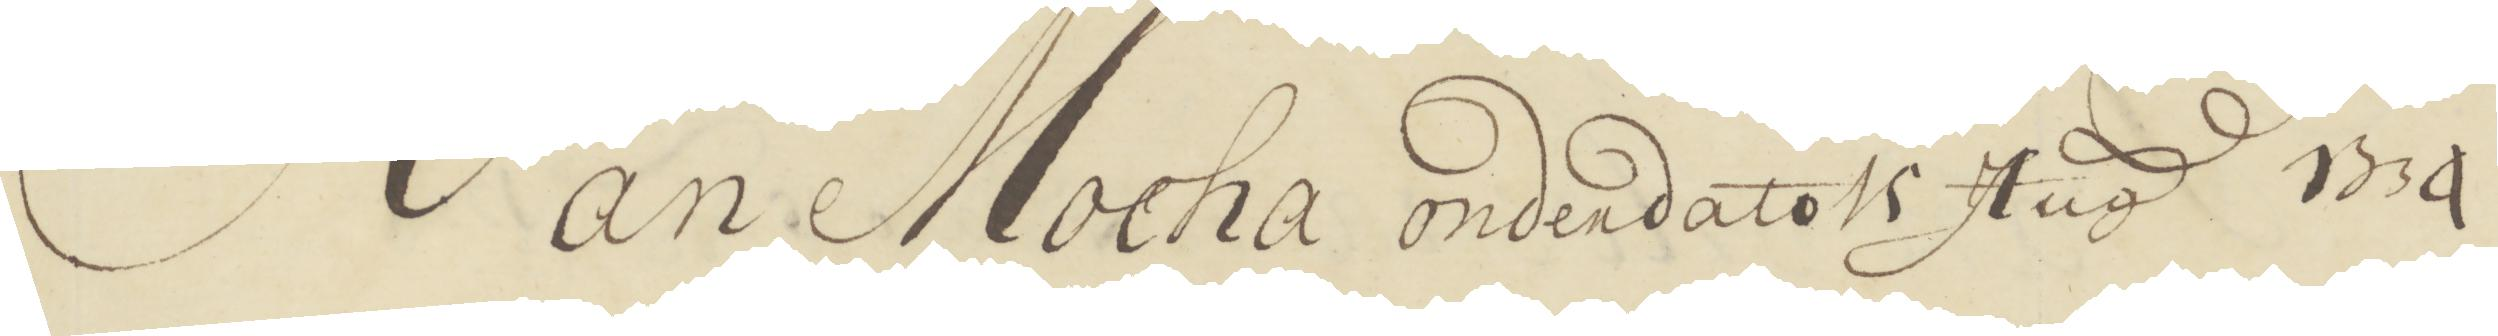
Van Mocha onder dato 15 Aug 1734
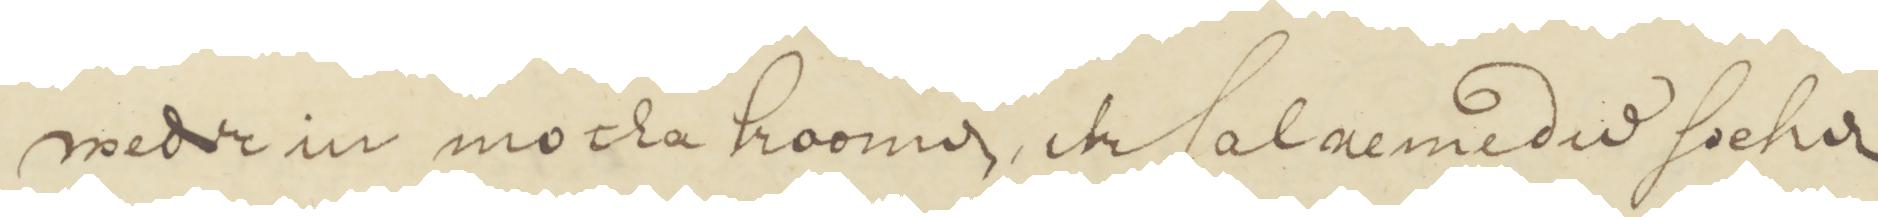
weder in mocha koomen, ik sal remedie soeken
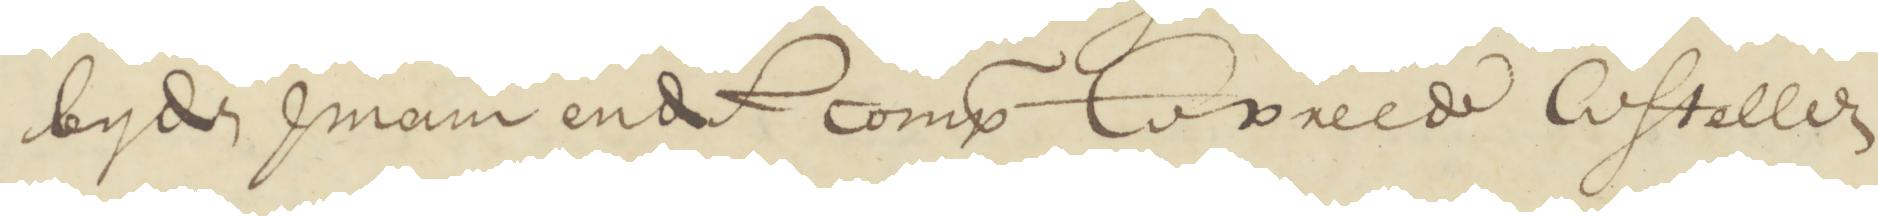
by den jmam ende comp te vreede testellen
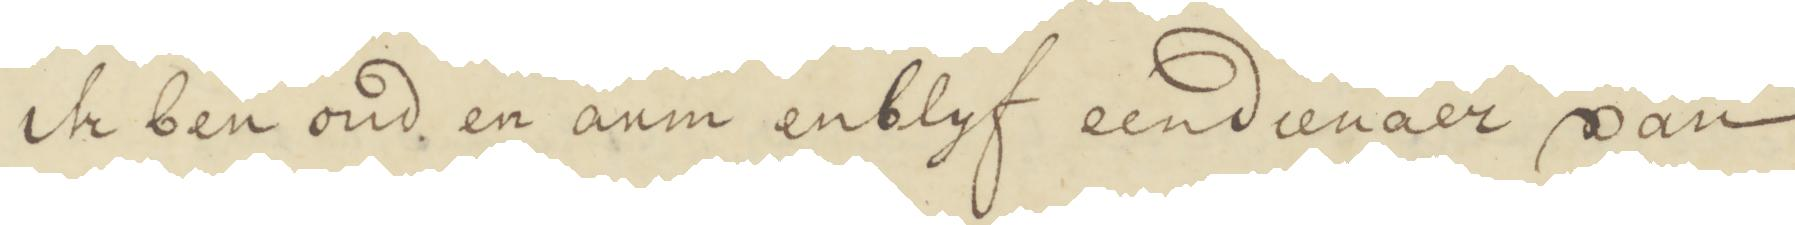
ik ben oud en arm en blyf een dienaer van
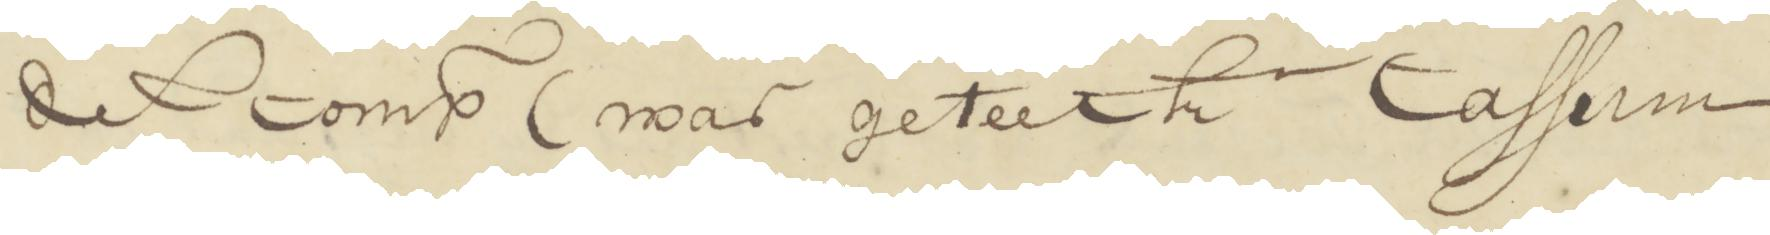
de E comp ( was geteeckt Cassum
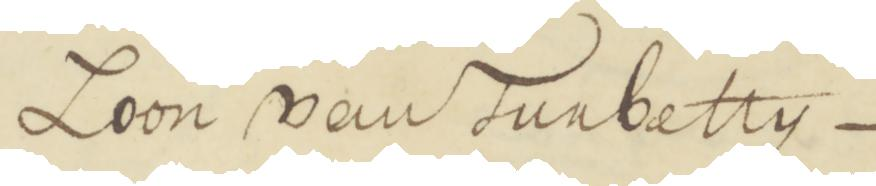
zoon van Turbetty
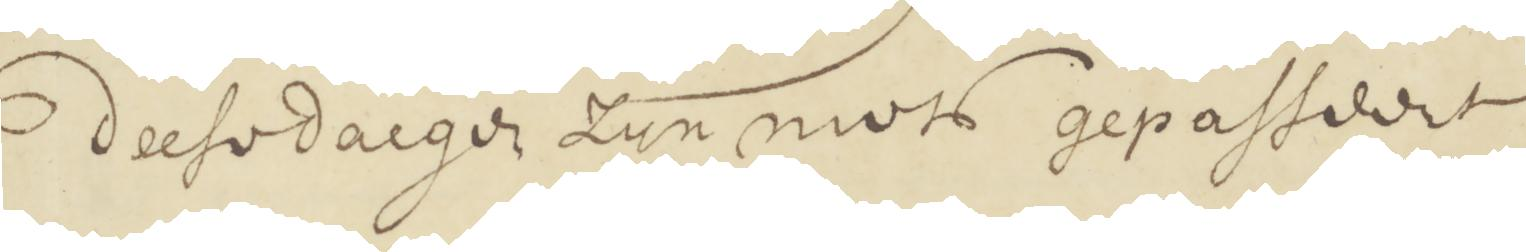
deese daegen zyn niets gepasseert
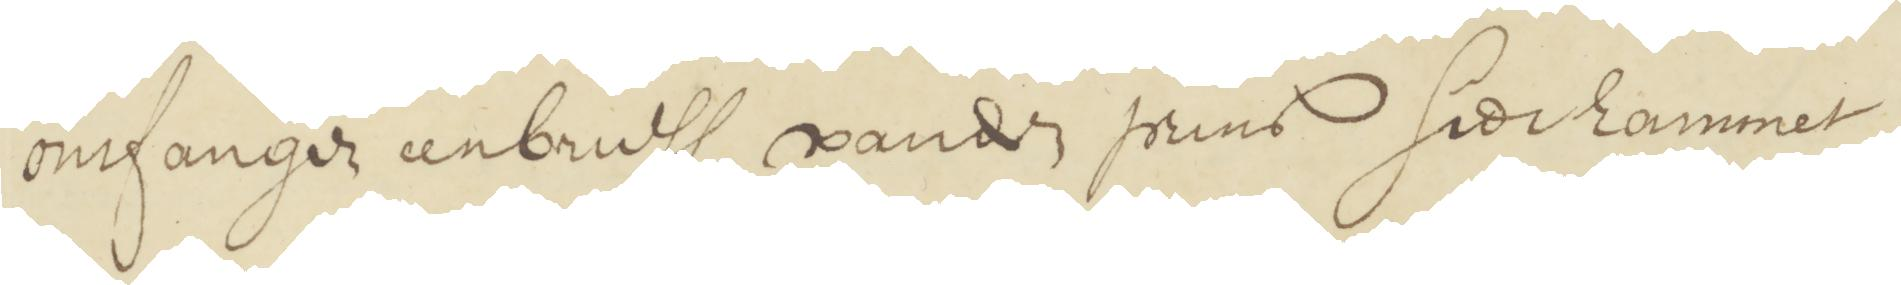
ontfangen eer brieff vanden prins sidihammet
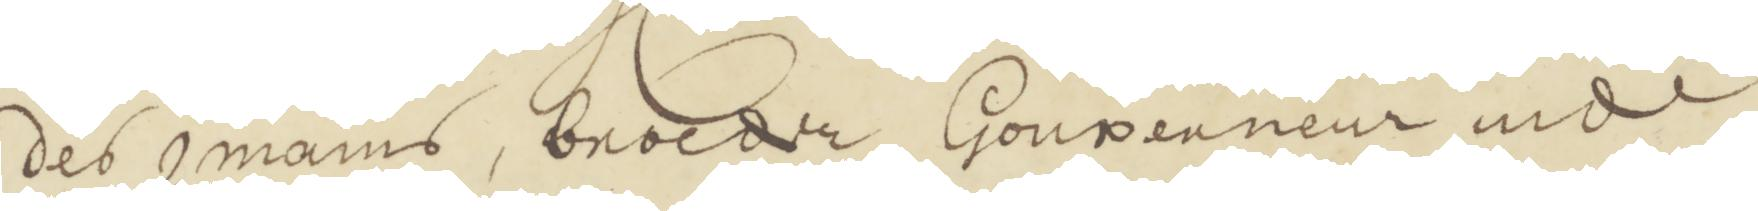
des jmams, broeder Gouverneur inde
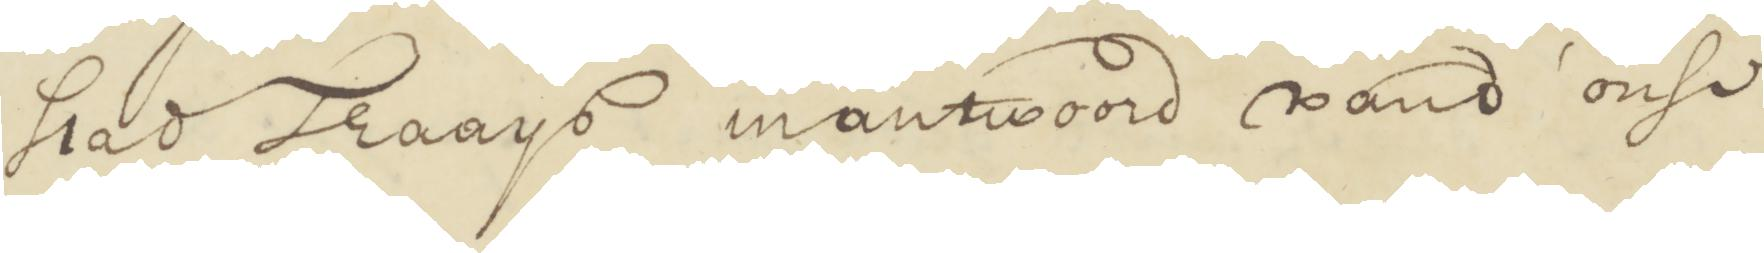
stad Thaays inantwoord vand’ onse
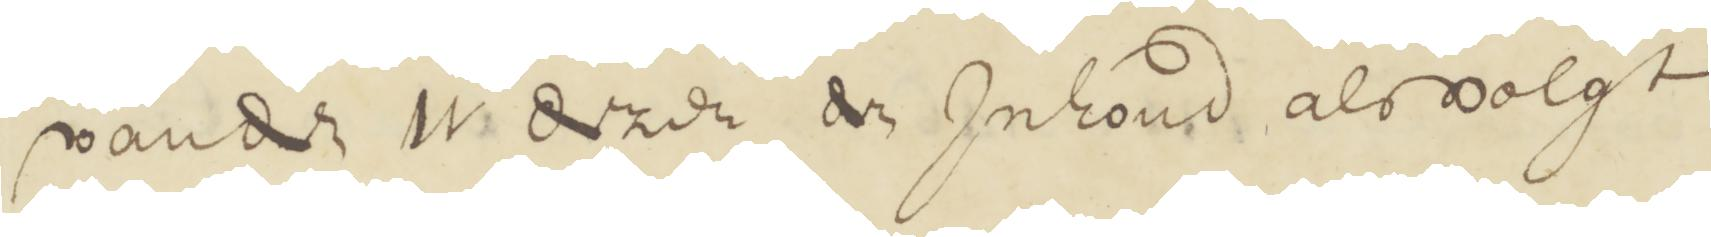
van den 11 dezer den jnhoud alsvolgt
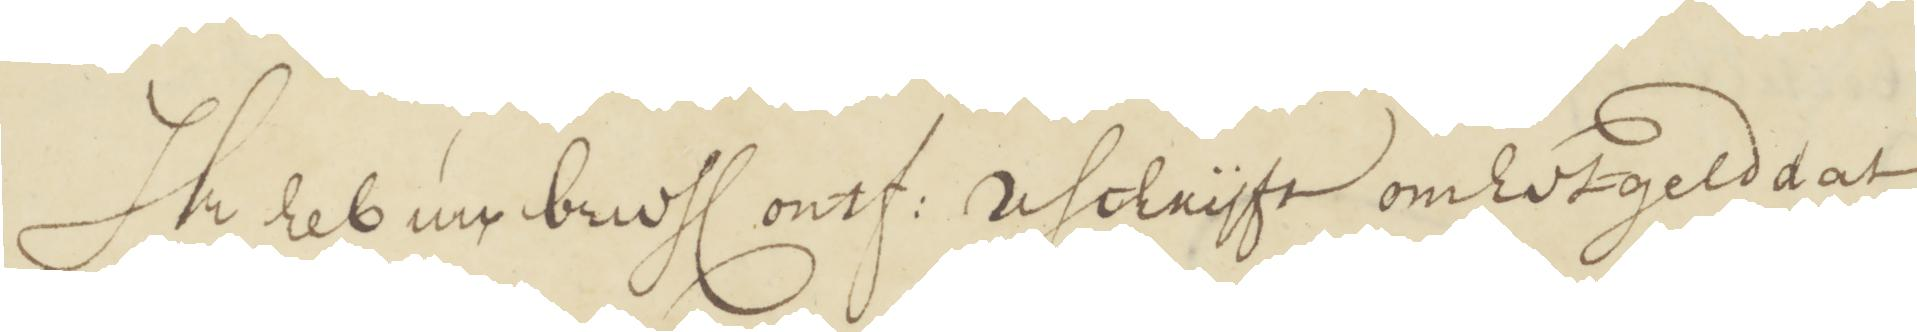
Jk heb uw brieff ontf: u schrijft om het geld dat
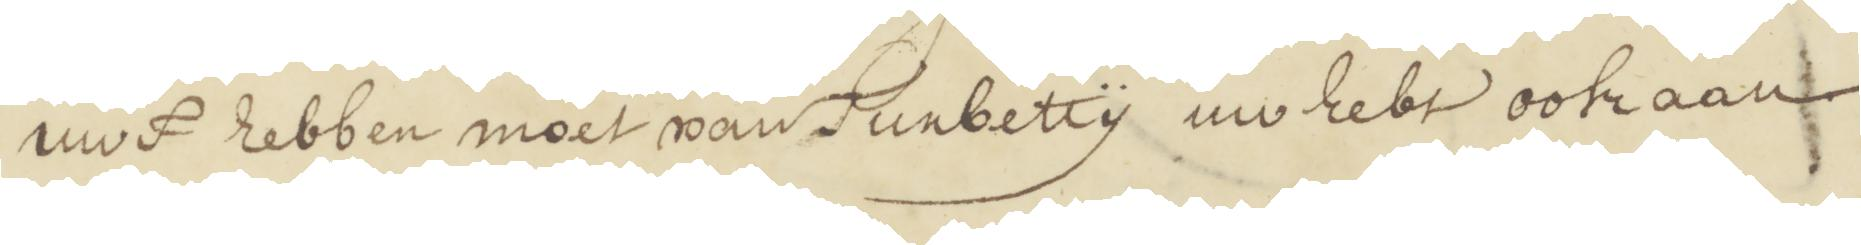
uw E hebben moet van Turbettij uw hebt ook aan
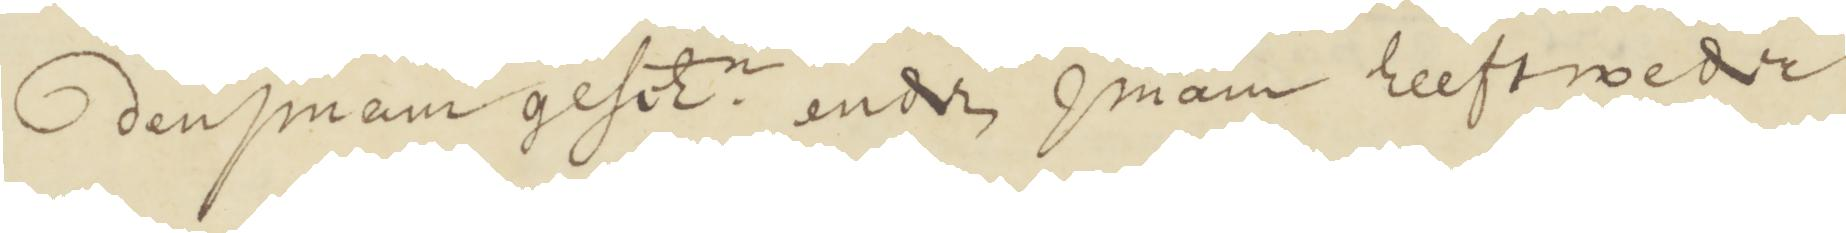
den jmam gesch.n enden jmam heeft weder
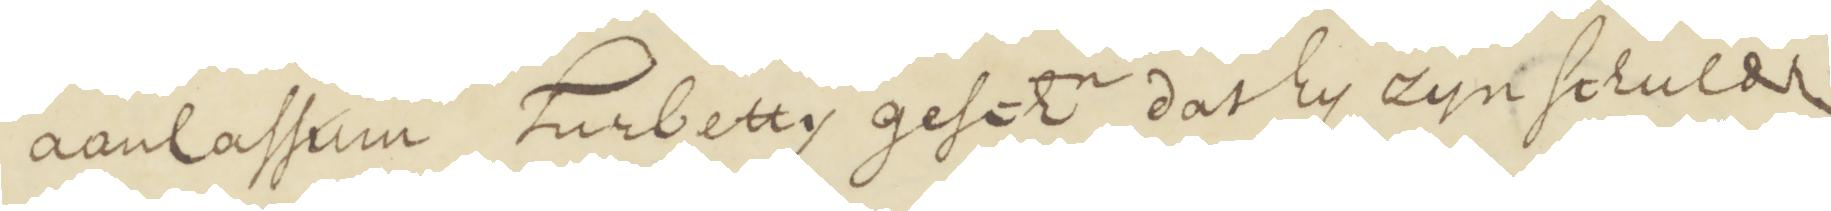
aan cassum Turbetty geschn dat hy zyn schulden
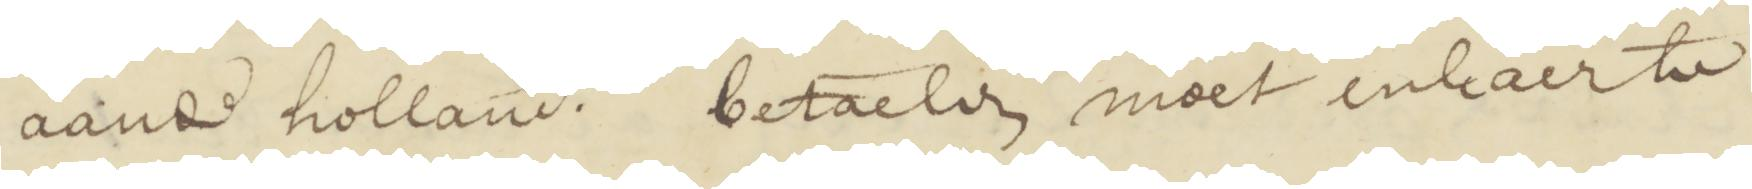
aande holland.s betaelen moet en haer te
